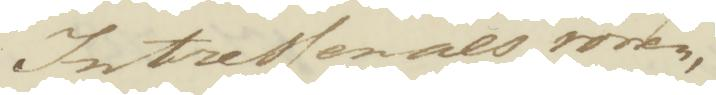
Intressen als voren,
